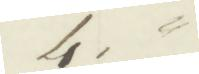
4. „
